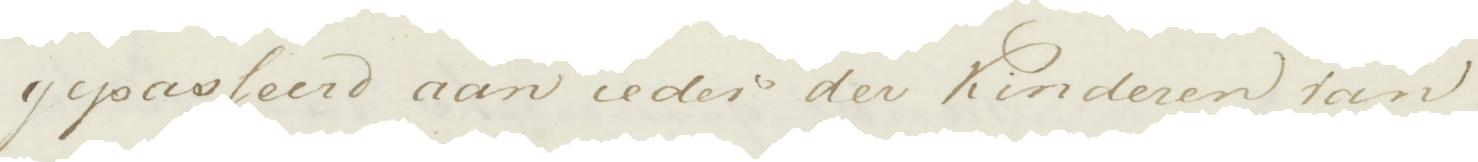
gepasseerd aan ieder der Kinderen van
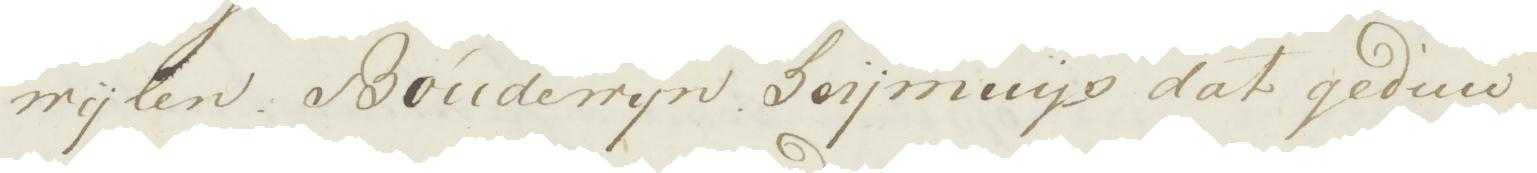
wijlen: Boudewijn Heijmuijs dat geduu
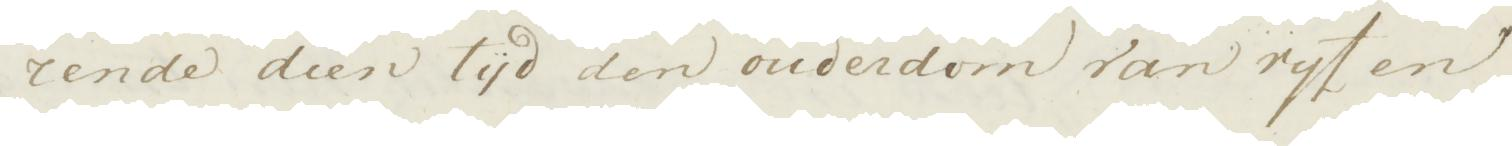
rende dien tijd den ouderdom van vijf en
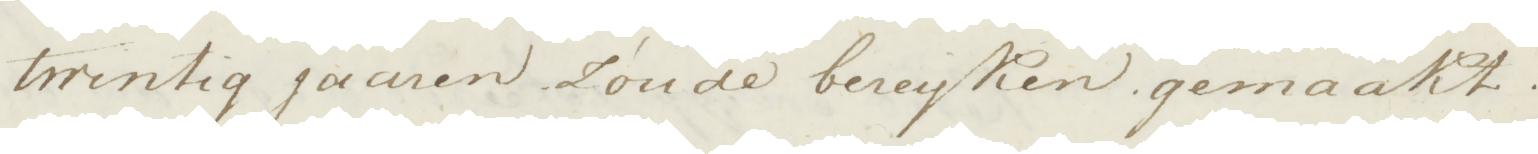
twintig jaaren zoude bereyken gemaakt.
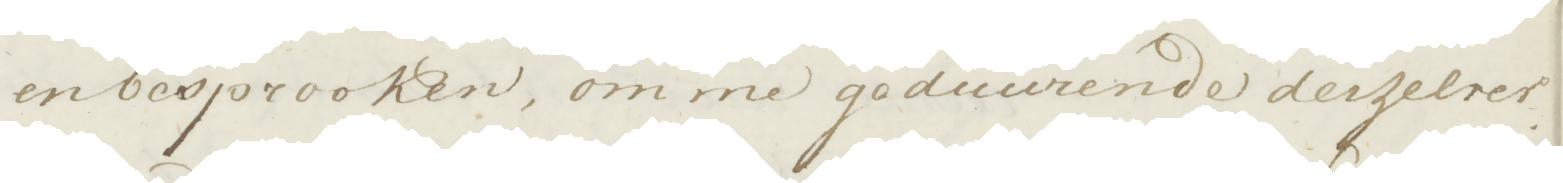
en besprooken, omme geduurende derzelver„
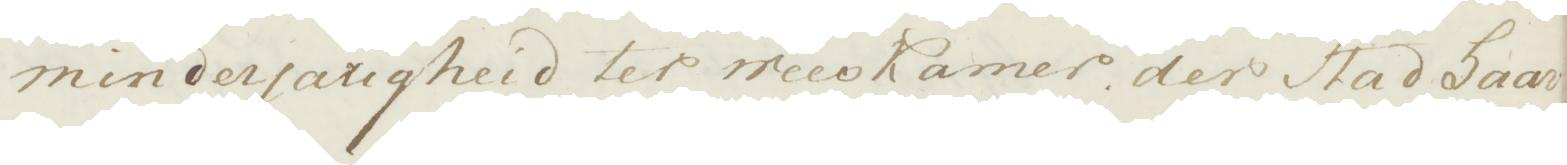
minderjarigheid ter weeskamer, der Stad Haar
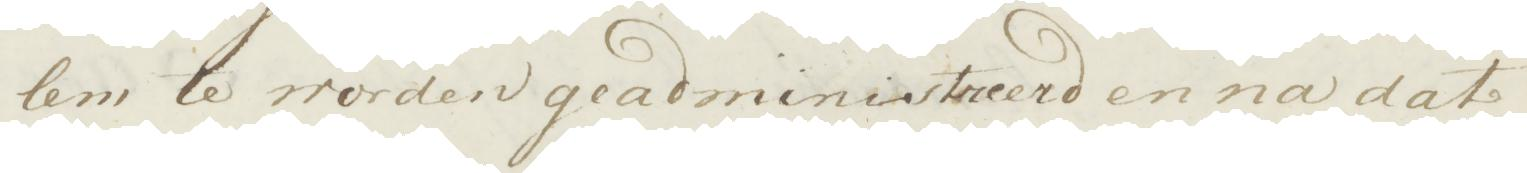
lem te worden geadministreerd en na dat
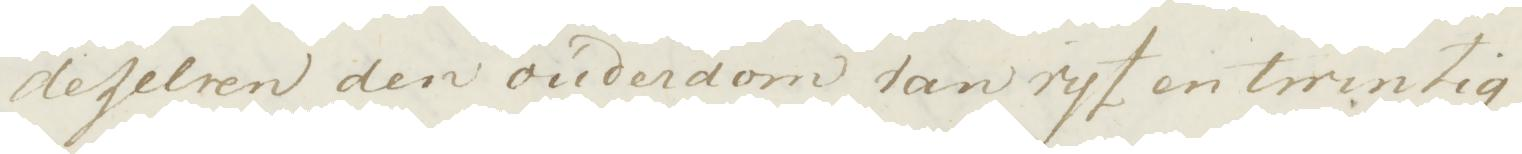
dezelven den ouderdom van vyf en twintig
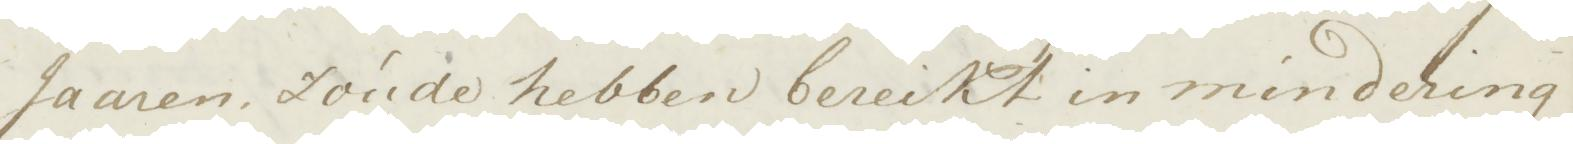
Jaaren, zoude hebben bereikt in mindering
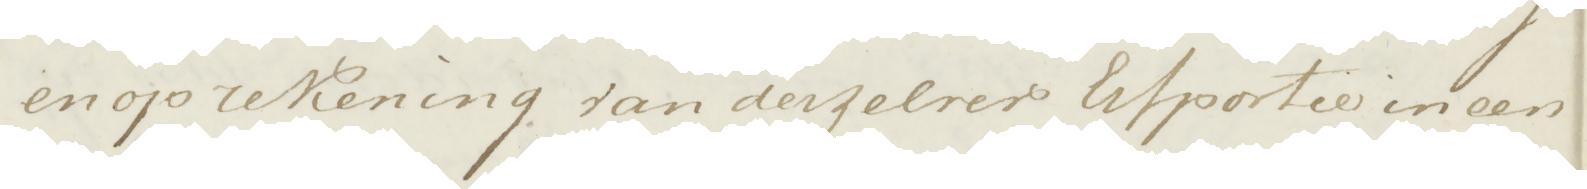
en op rekening van derselver Erfportie in een
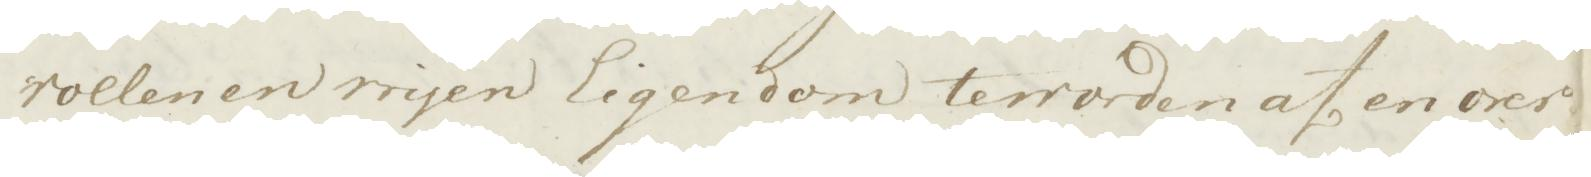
vollen en vrijen Eigendom te worden af en over
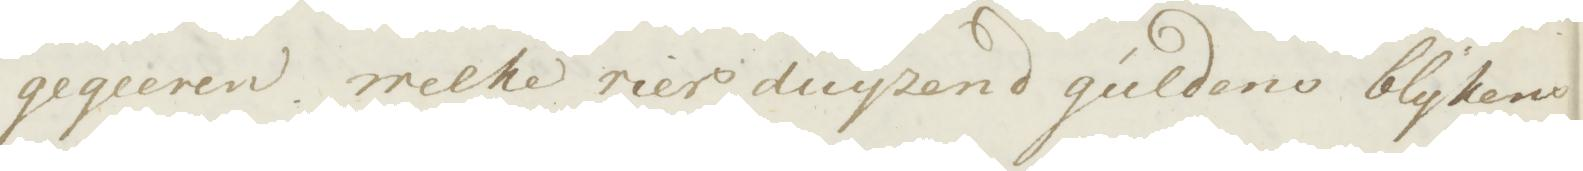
gegeeven. welke vier duijzend guldens blijkens
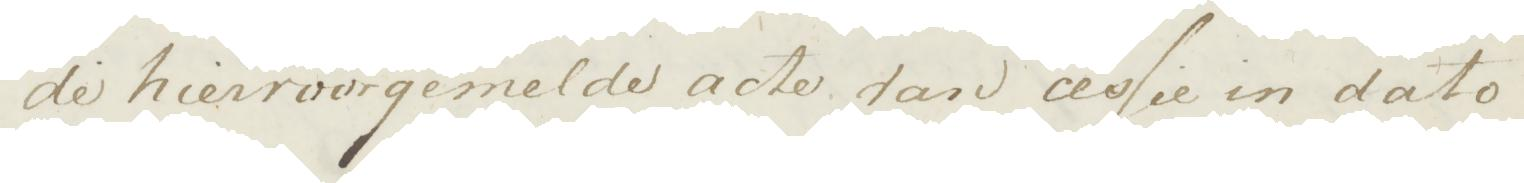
de hiervoorgemelde acte van cessie in dato
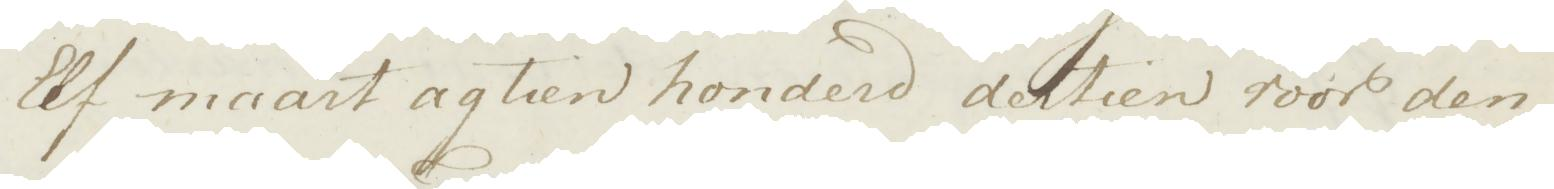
Elf maart agtien honderd dertien voor den
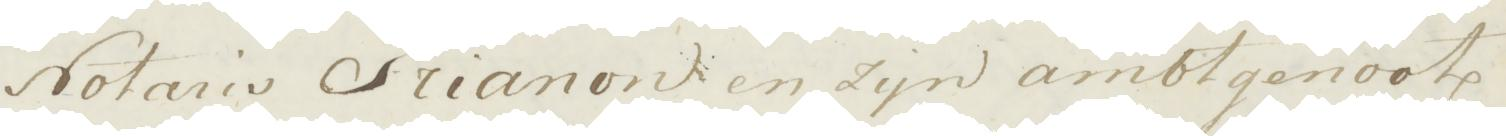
Notaris Trianon en zyn ambtgenoot
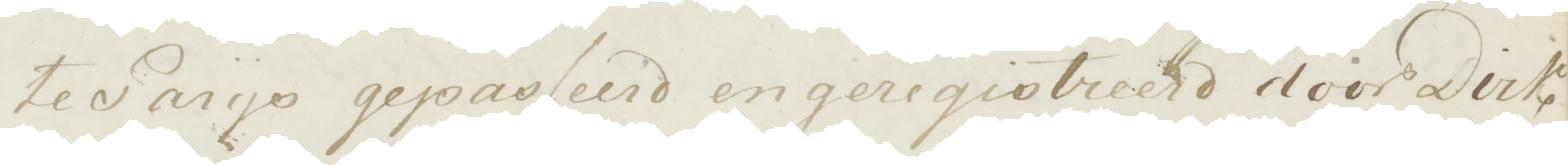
te Parijs gepasseerd en geregistreerd door Dirk
